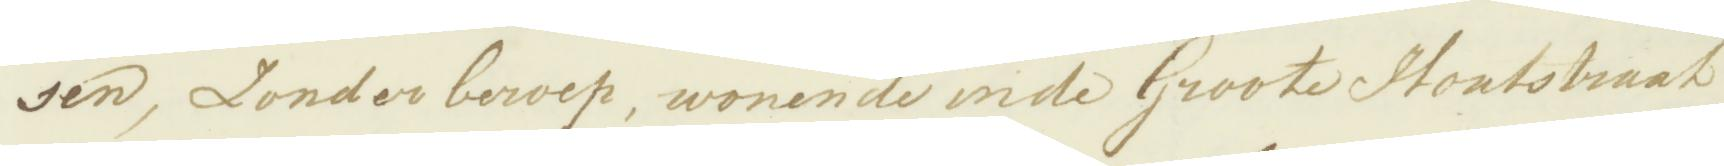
sen, Zonder beroep, wonende in de Groote Houtstraat
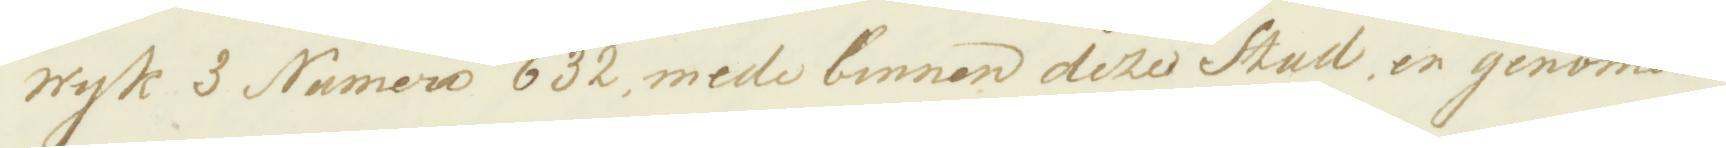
wyk 3 Numero 632, mede binnen deze stad, en genomen
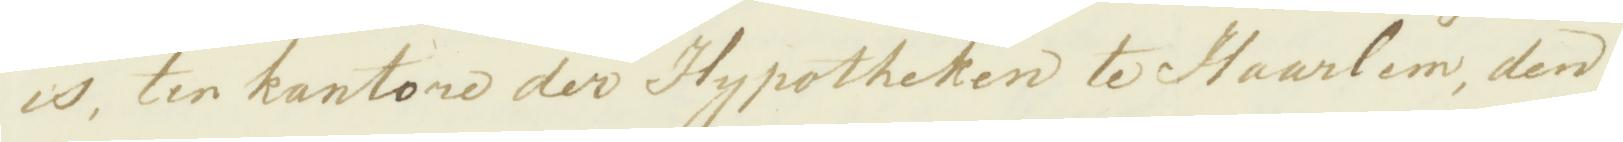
is, ten kantore der Hypotheken te Haarlem, den
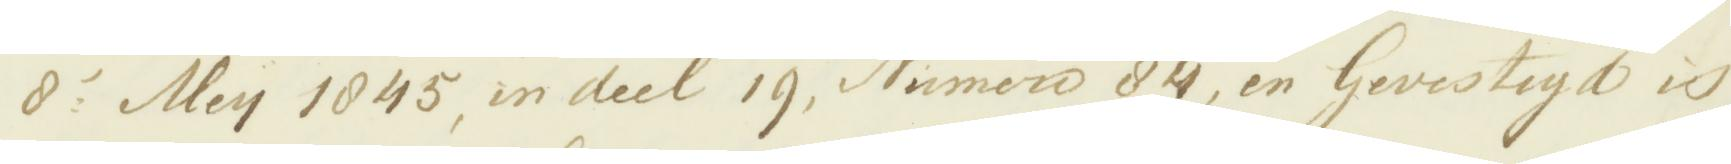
8:' Mey 1845, in deel 19, Numero 84, en Gevestigd is
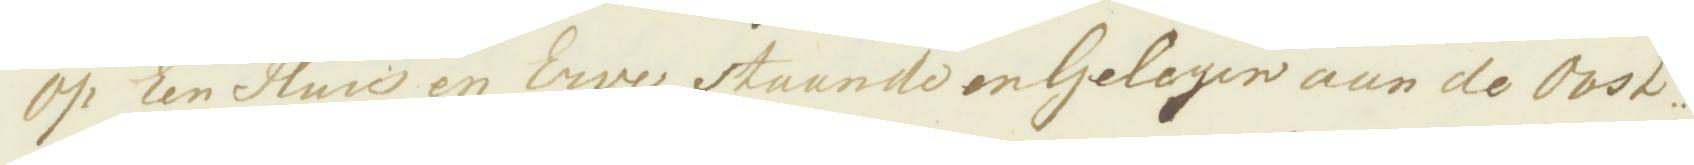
op Een Huis en Erve, staande en Gelegen aan de Oost„
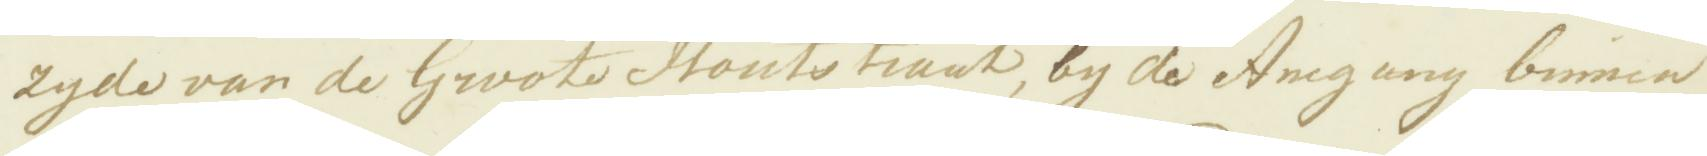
zyde van de Groote Houtstraat, bij de Anegang binnen
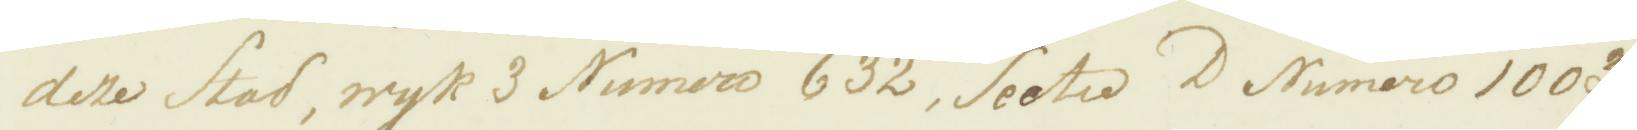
deze Stad, wyk 3 Numero 632, Sectie D Numero 1003,
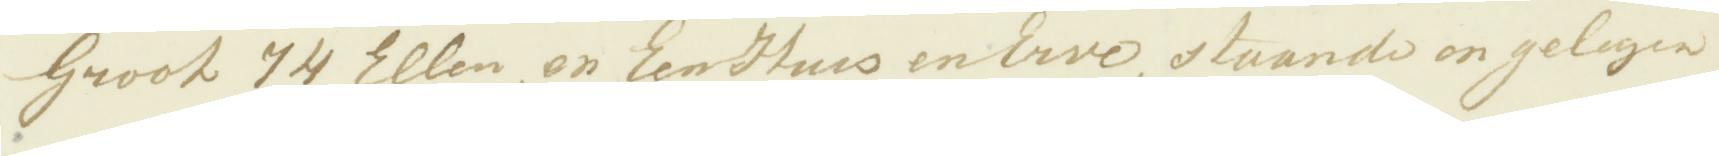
Groot 74 Ellen, en Een Huis en Erve, staande en gelegen
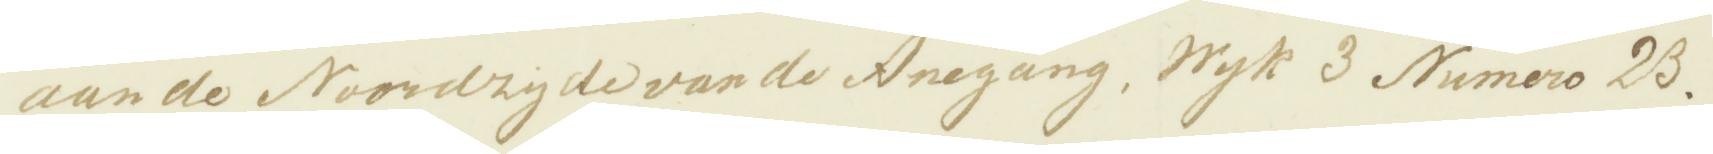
aan de Noordzijde van de Anegang, wyk 3 Numero 23.
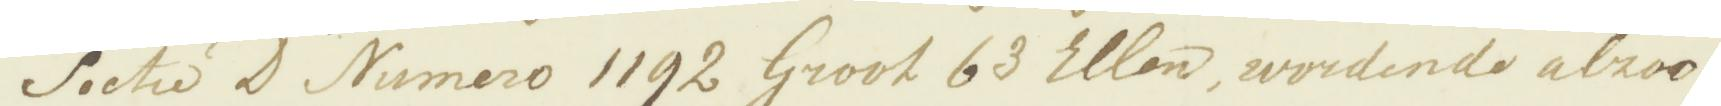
Sectie D Numero 1192 Groot 63 Ellen, wordende alzoo
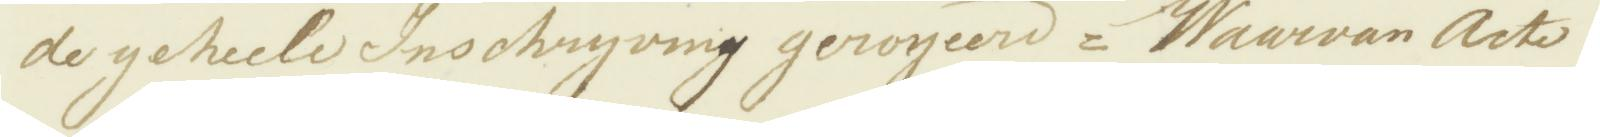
de geheele Inschryving geroyeerd = Waarvan Acte
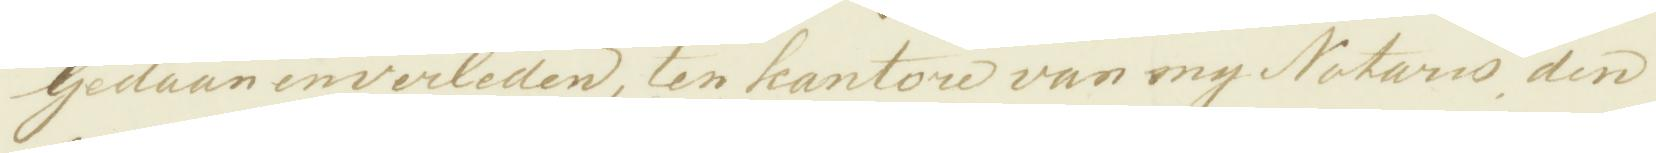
Gedaan en verleden, ten kantore van my Notaris den
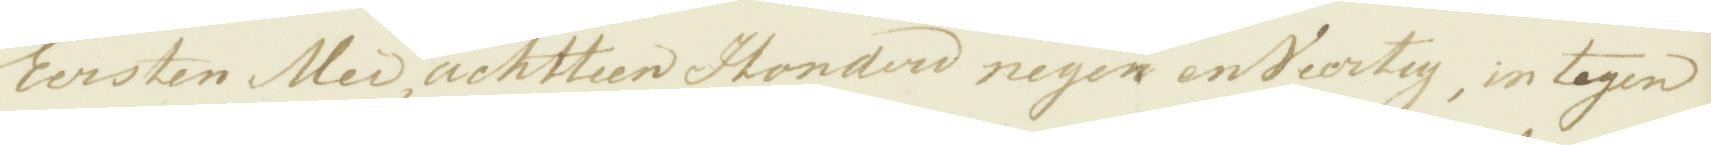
Eersten Mei, achttien Honderd negen en Veertig, in tegen
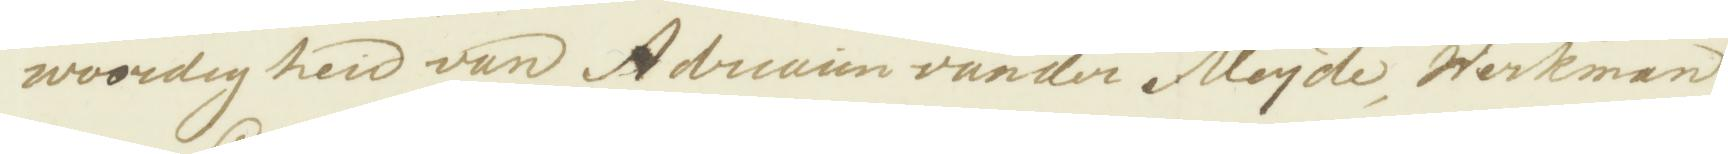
woordigheid van Adriaan van der Meijde, Werkman
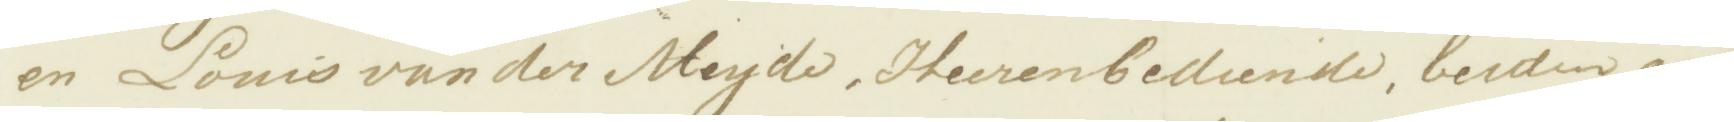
en Louis van der Meyde, Heerenbediende, beiden aan
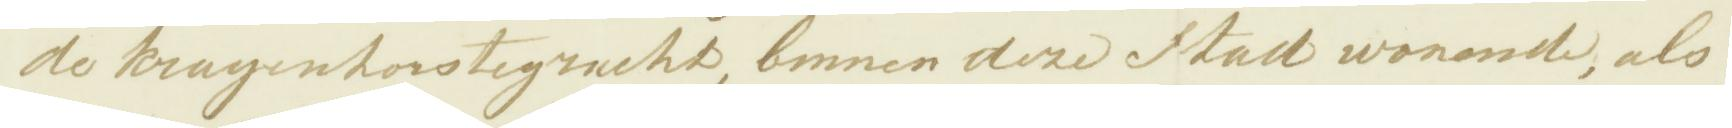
de krayenhorstegracht, binnen deze stad wonende, als
